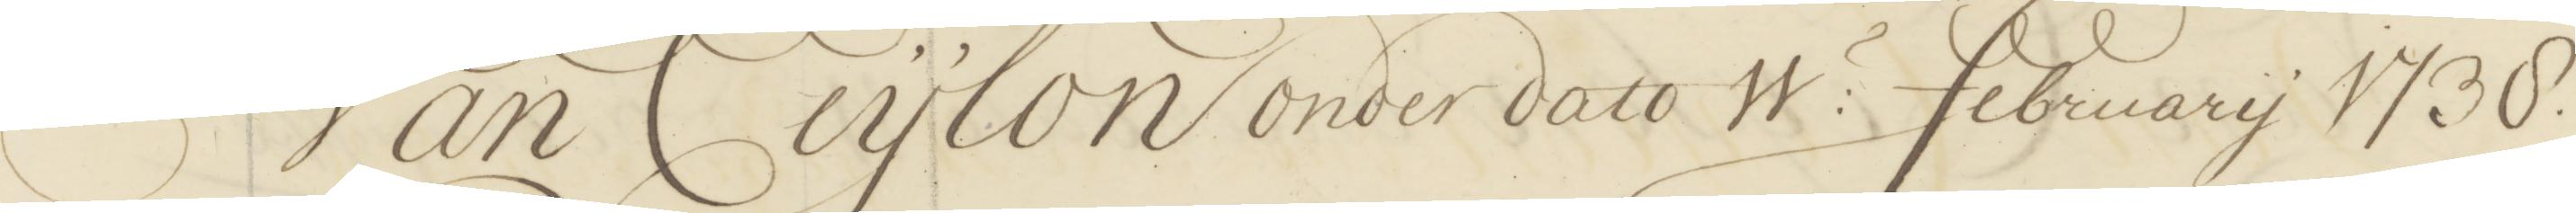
Van Ceijlon onder dato 11:' februarij 1738.
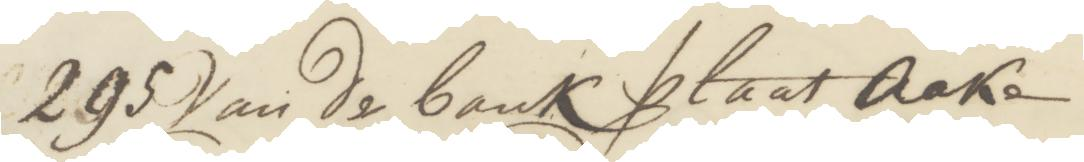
295 Van de bank plaat Aake
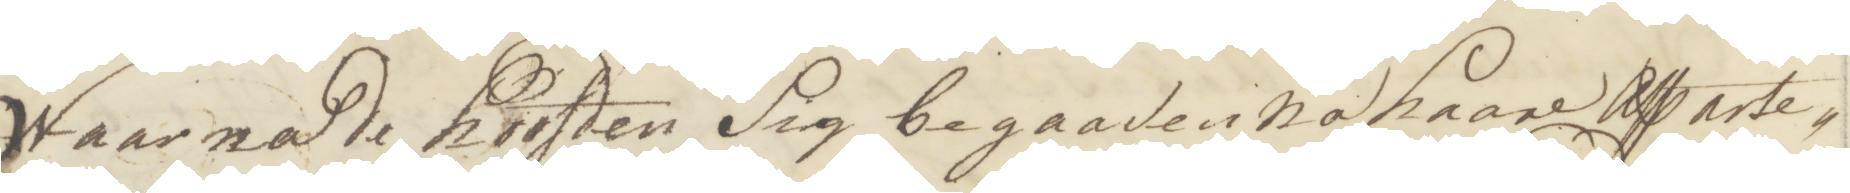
Waar na de hoofden sig begaaven na haare apparte„
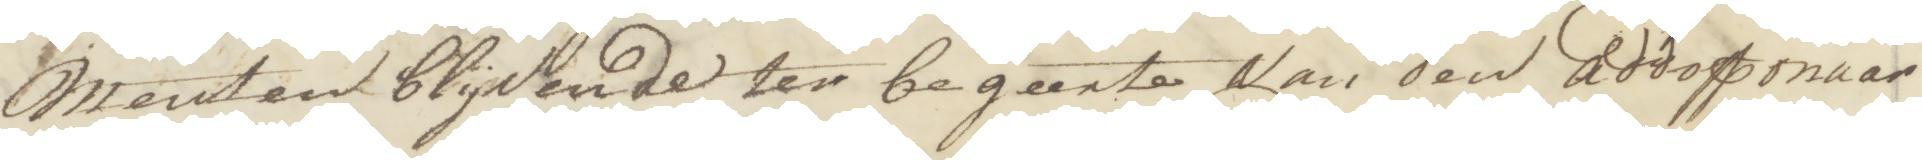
Menten blijvende ter begeerte van den addopponaar
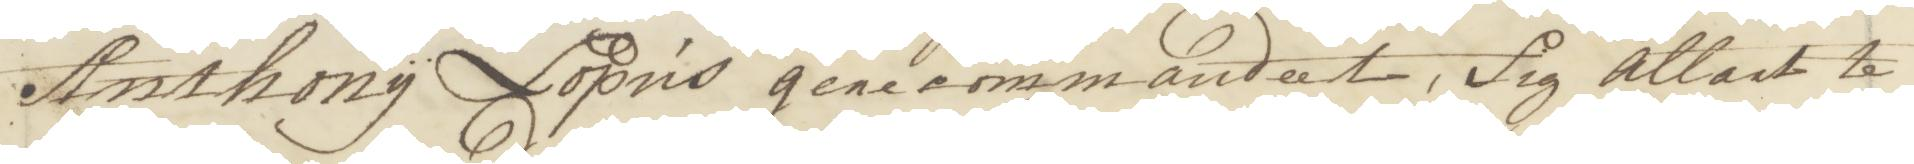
Anthonij Lopus gerecommandeet, sig allast te
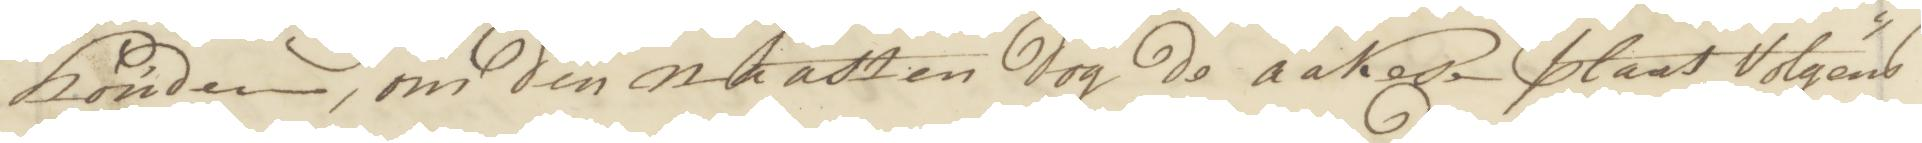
houden, om den naasten dog de aakese plaat volgens
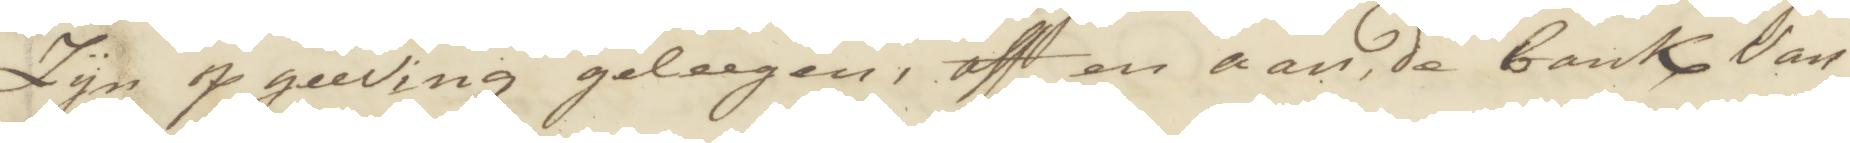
zijn op geeving geleegen; aff en aan, de bank van
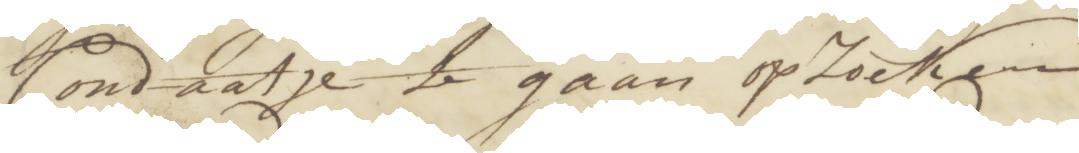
Cond-aatje te gaan op zoeken
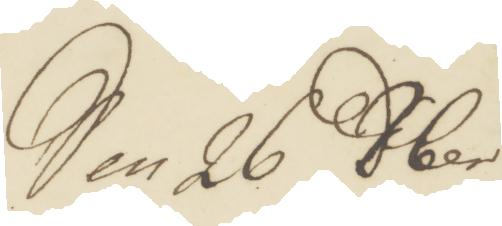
Den 26 8ber
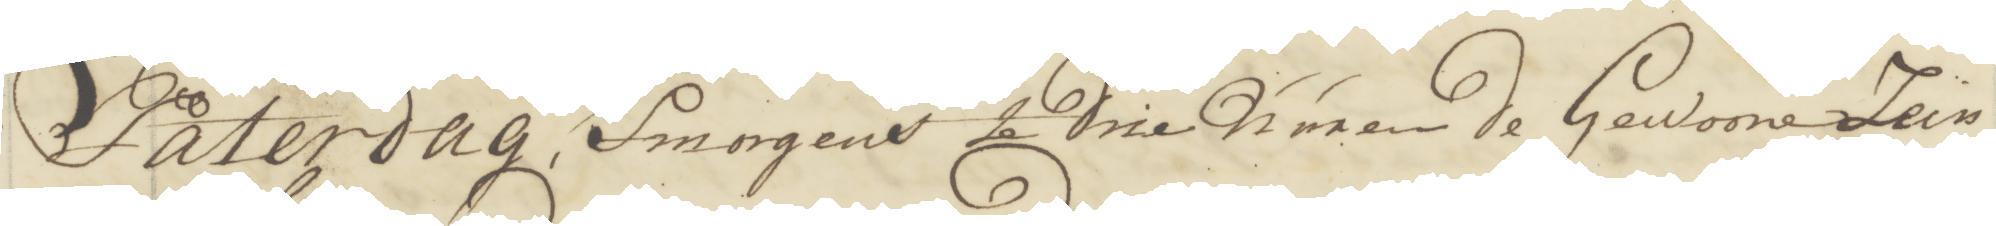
Saterdag, Smorgens te drie Uuren de Gewoone Zein
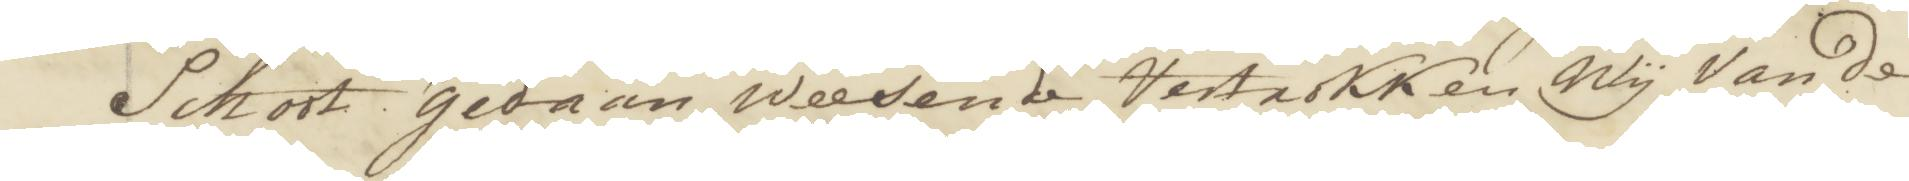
schoot gedaan weesende vertrokken wij van de
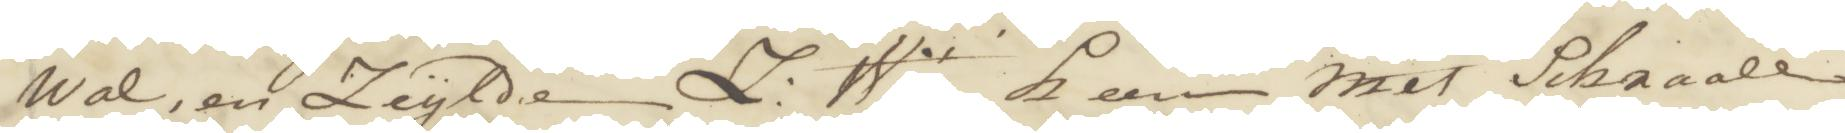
wal, en zeijlde Z: W„t heen met schraale
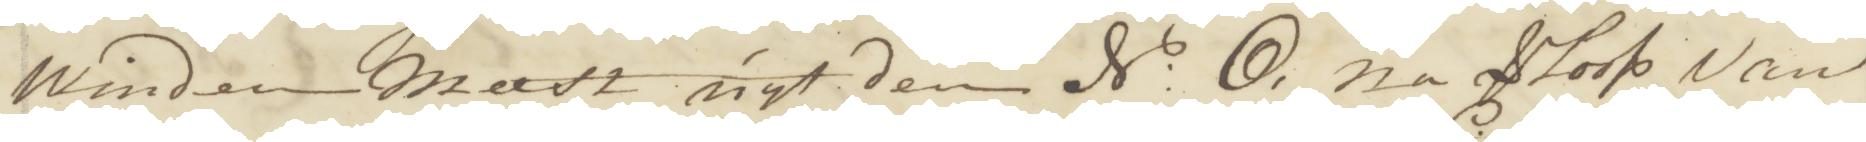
Winden Meest uyt den N: O. na verloop van
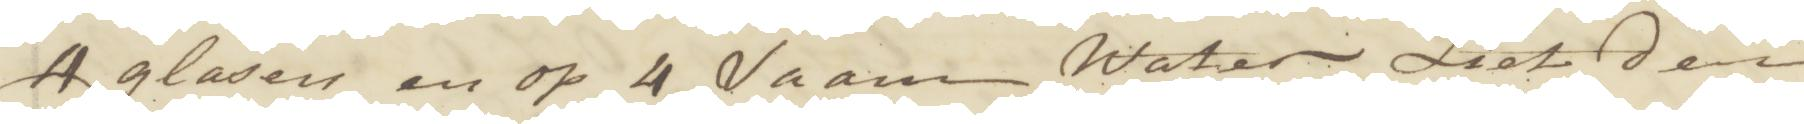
4 glasen en op 4 Vaam Water Liet den
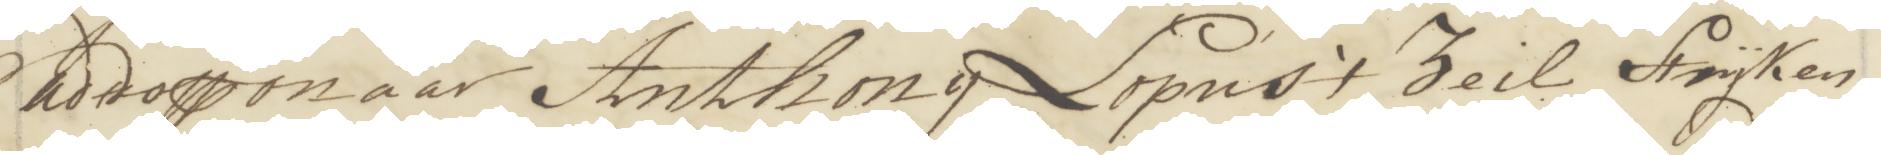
addopponaar Anthony Lopus 't Zeil strijken
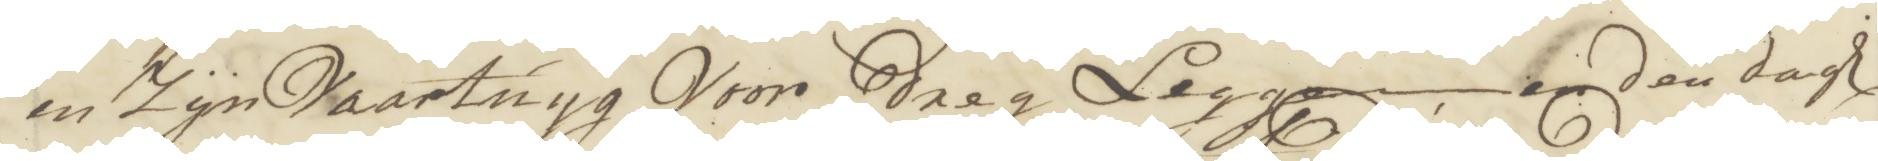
en zijn Vaartuyg Voor dreg Leggen, en den dagh
